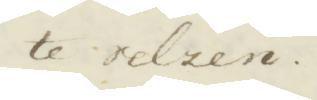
te velzen.
